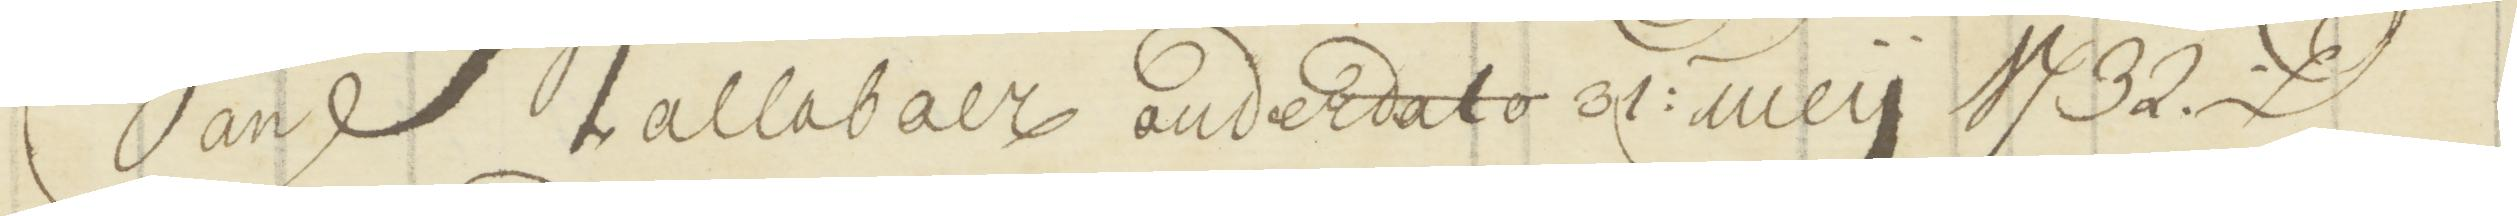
Van Mallabaer onder dato 31:' meij 1732. ~
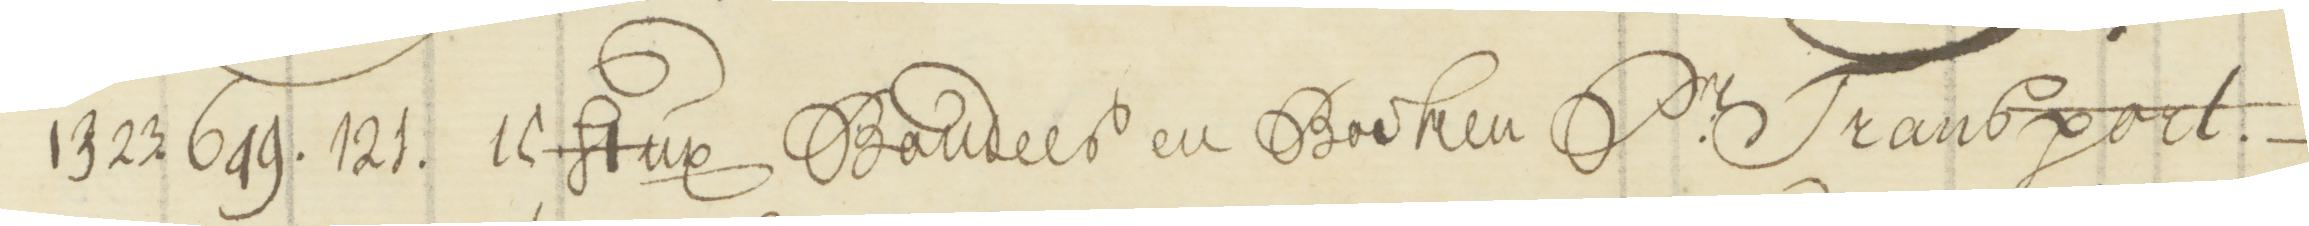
1323. 649. 121. 15 Stux Bondels en Boeken P„r Transport.—
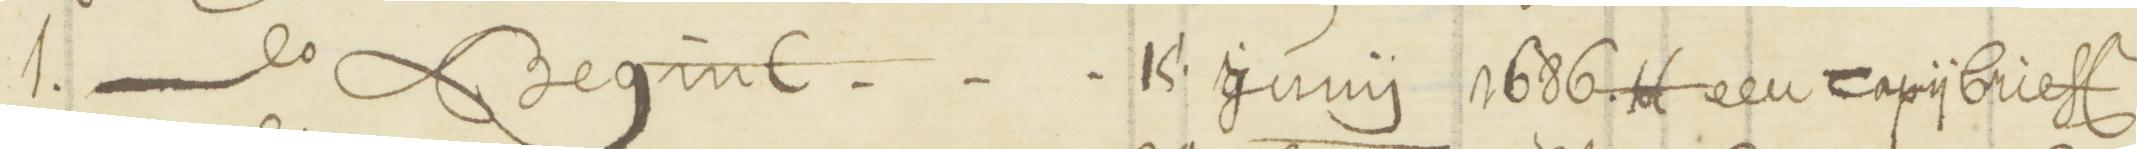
1. _o Begint......15: Junij 1686. tot een Copij brieff
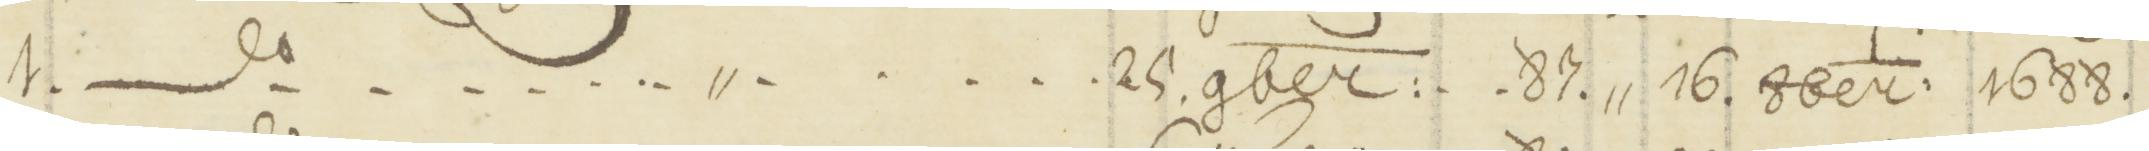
1. _o.....„..... 25 gber:.. 87 „ 16. 8ber: 1688.
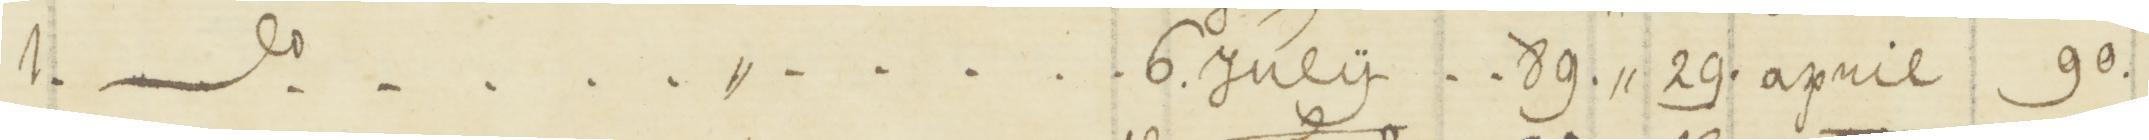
1. _o.....„.....6. Julij... 89 „ 29. april 90.
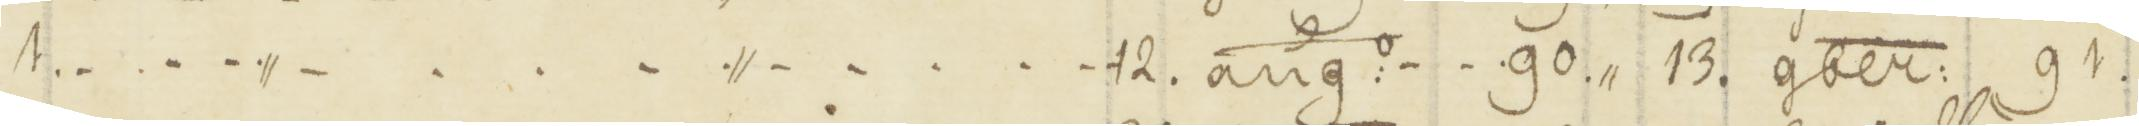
1.....„.....„.....12. aug:o... 90 „ 13. gber: 91.
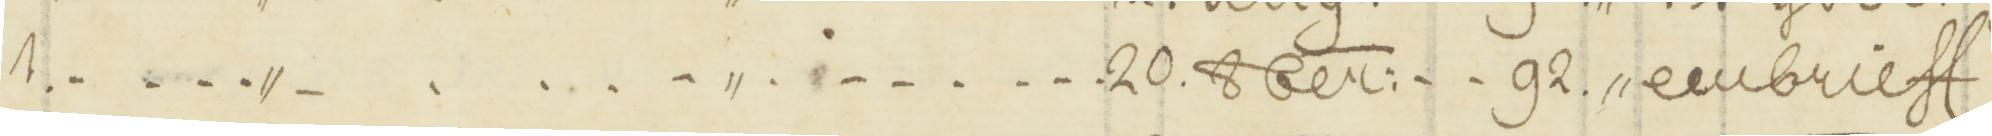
1.....„.....„.....20. 8ber:... 92 „ een brieff
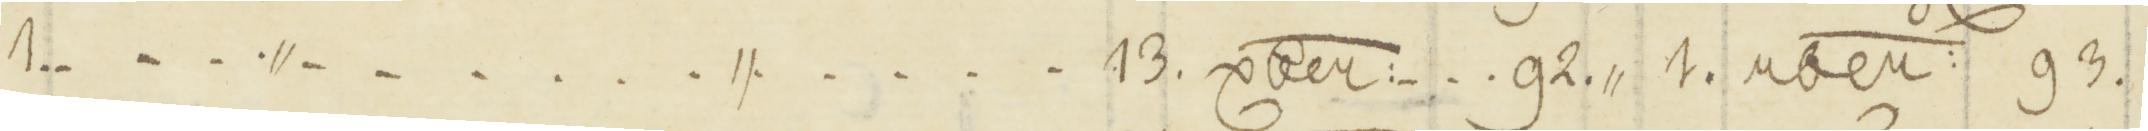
1.....„.....„.....13. xber... 92. „ 1. rber: 93.
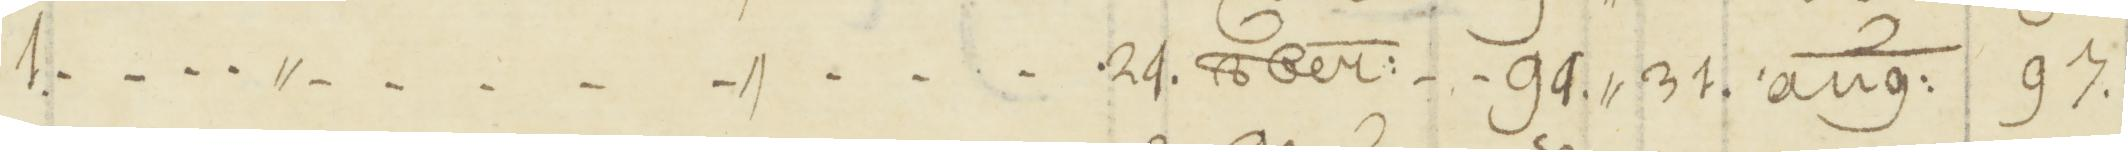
1.....„.....„.....24. 8ber:... 94. „ 31. aug: 97.
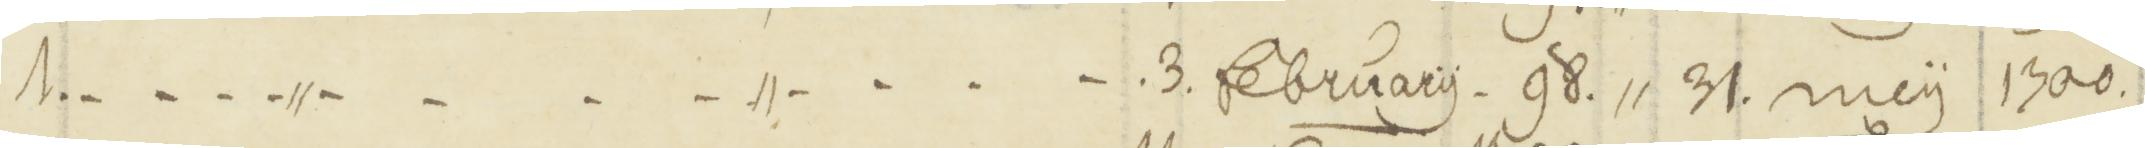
1.....„.....„.....3. februarij 98. „ 31. meij 1300.
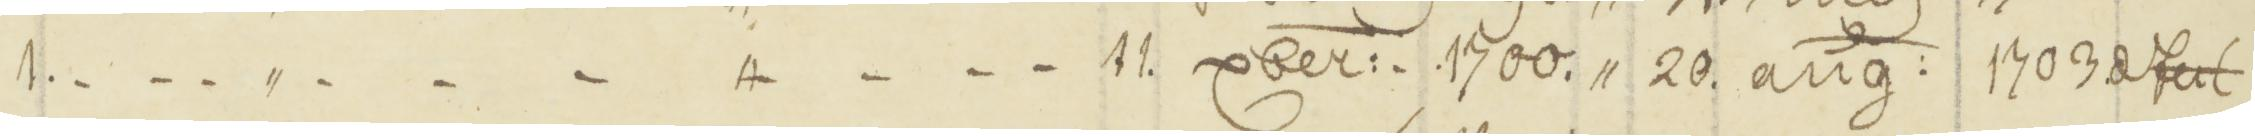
1.....„.....„.....11. xber:... 1700. „ 20. aug: 1703 defect
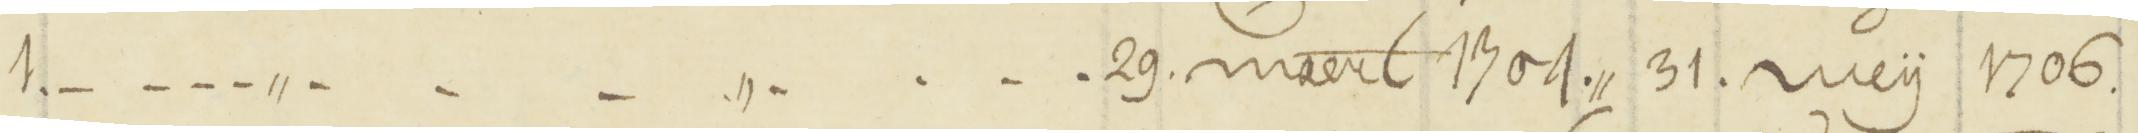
1.....„.....„.....29. maert 1704. „ 31 meij 1706.
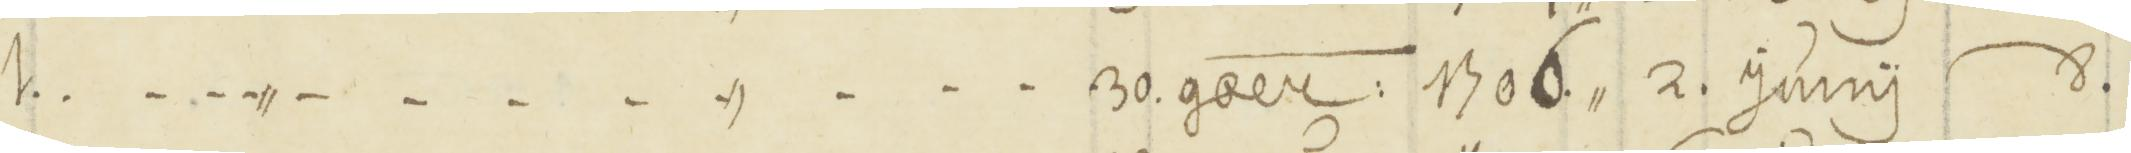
1.....„.....„.....30. gber: 1706.„ 2 Junij 8.
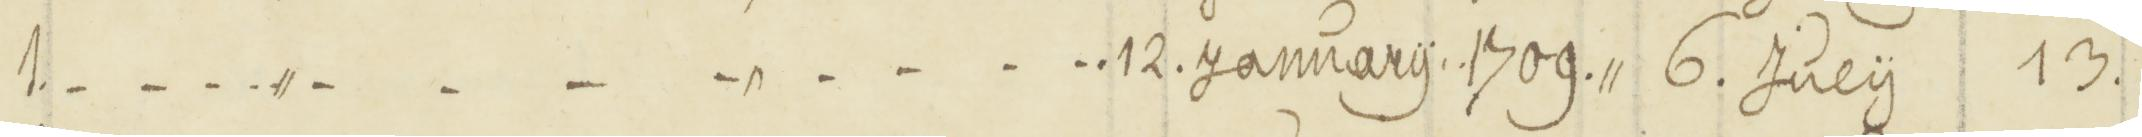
1.....„.....„.....12. Januarij. 1709. „ 6: Julij 13.
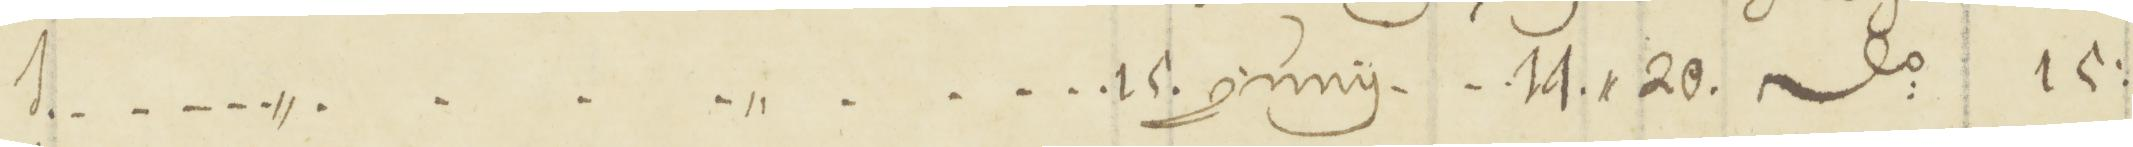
1.....„.....„.....15. junij...14.„ 20. _:o 15:
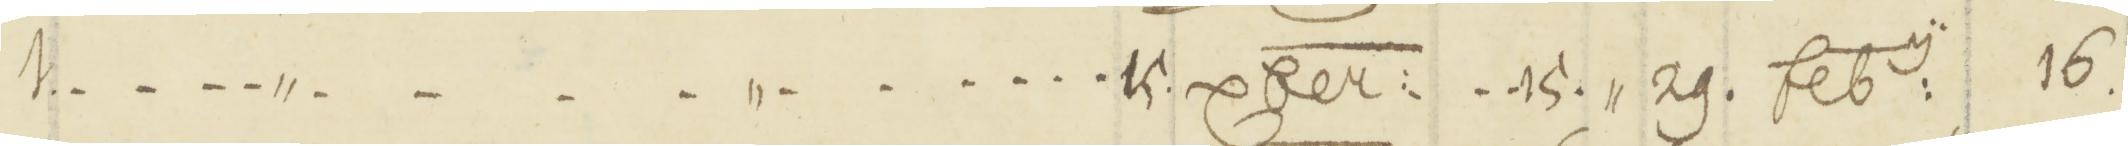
1.....„.....„.....15. xber:... 15. „ 29. feb:ij 16.
